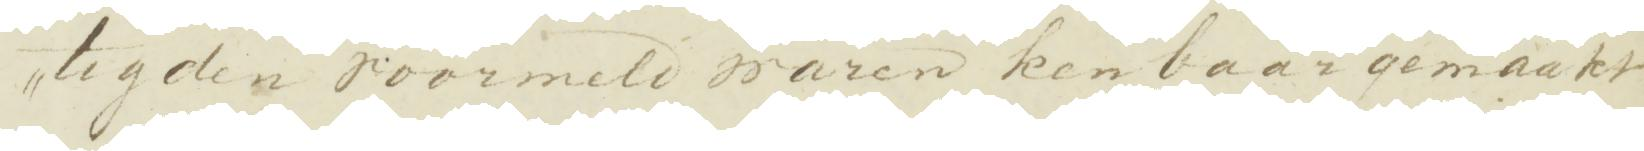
„tigden voormeld waren kenbaar gemaakt
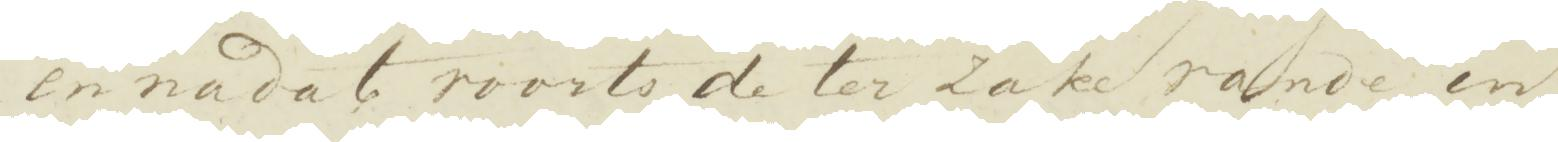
en nadat voorts de ter zake vande en
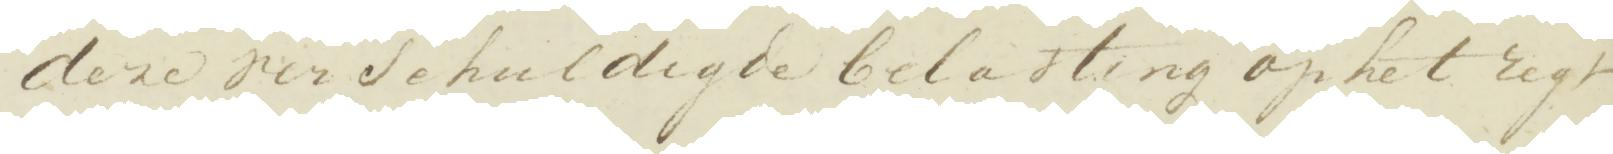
deze verschuldigde belasting op het regt
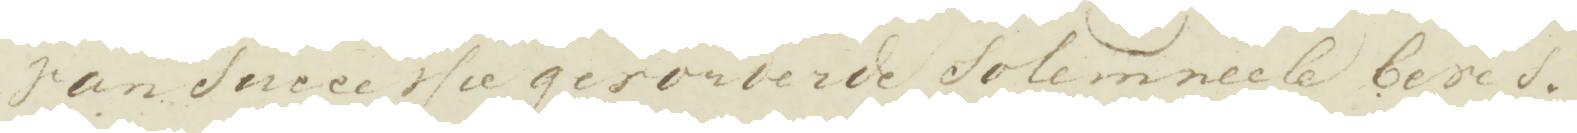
van successie gevorderde solemneele beves„
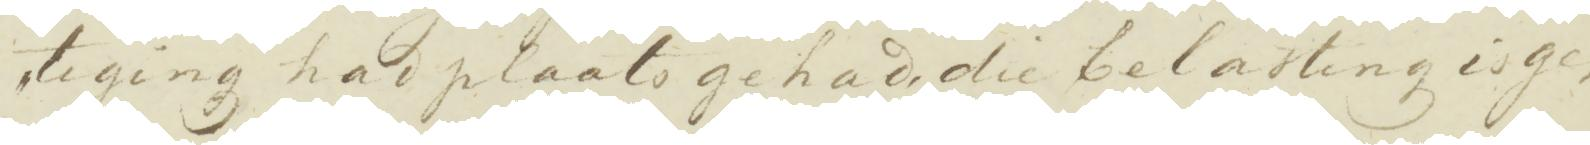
„tiging had plaats gehad, die belasting is ge
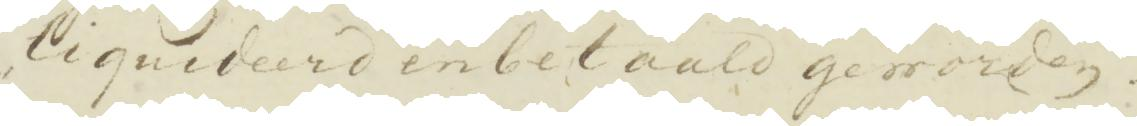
liquideerd en betaald geworden
